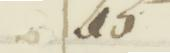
45
